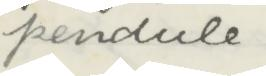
pendule
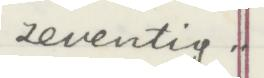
zeventig „
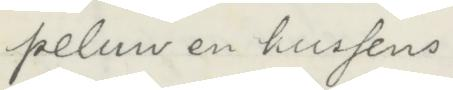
peluw en kussens
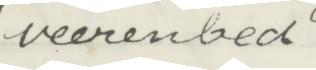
veerenbed
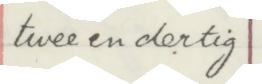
twee en dertig
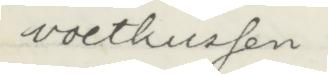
voetkussen
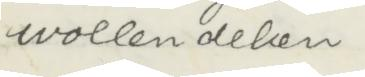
wollen deken
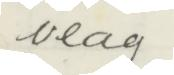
vlag
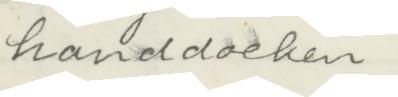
handdoeken
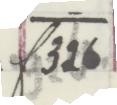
ƒ326
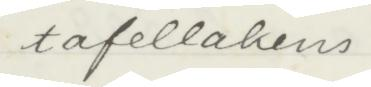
tafellakens
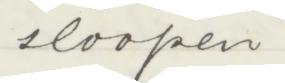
sloopen
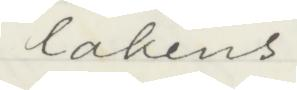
lakens
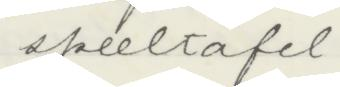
speeltafel
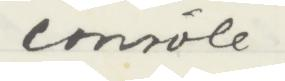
consóle
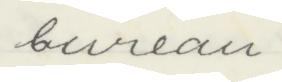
bureau
